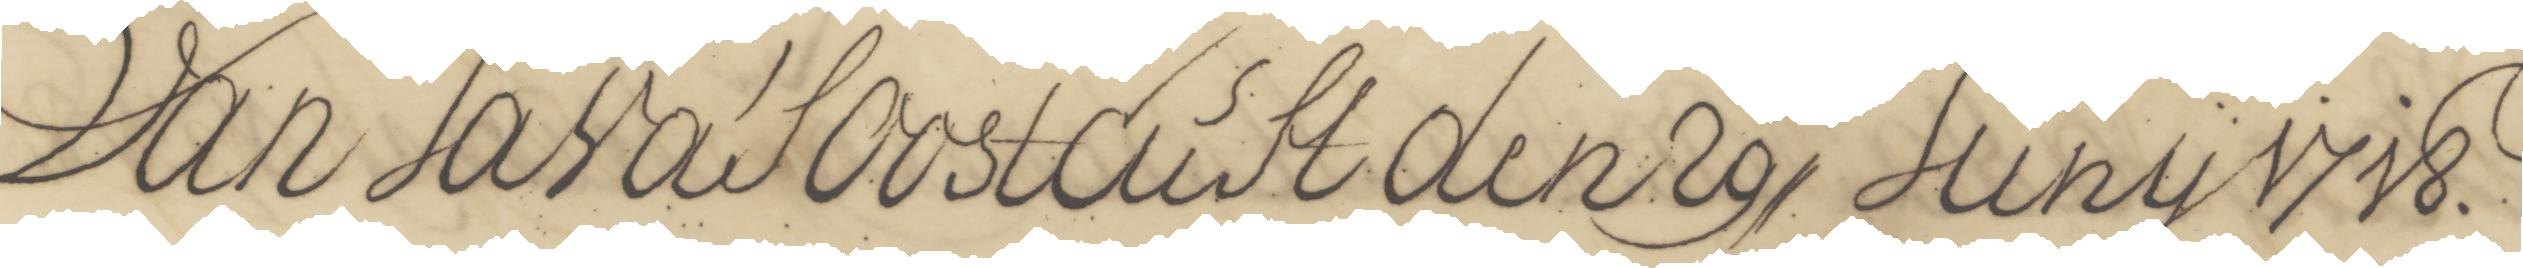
Van Java's Oostcust den 29„en Iunij 1718.
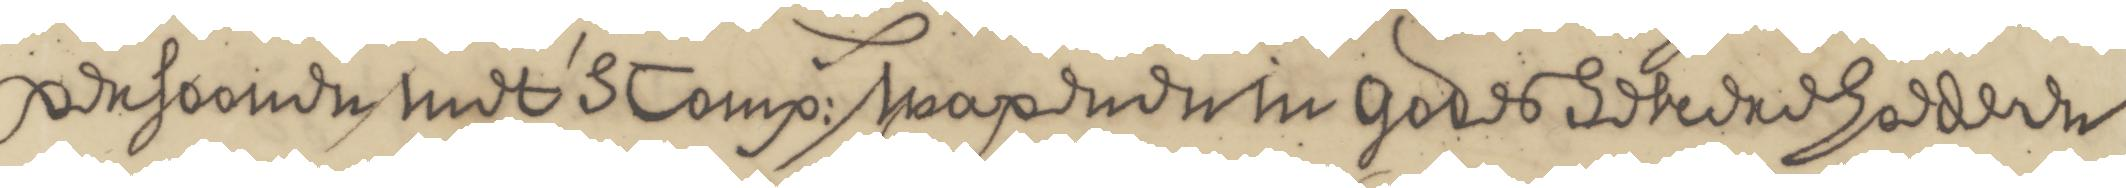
persoonen met ’s Comp:s wapenen in godes sekere hoederen
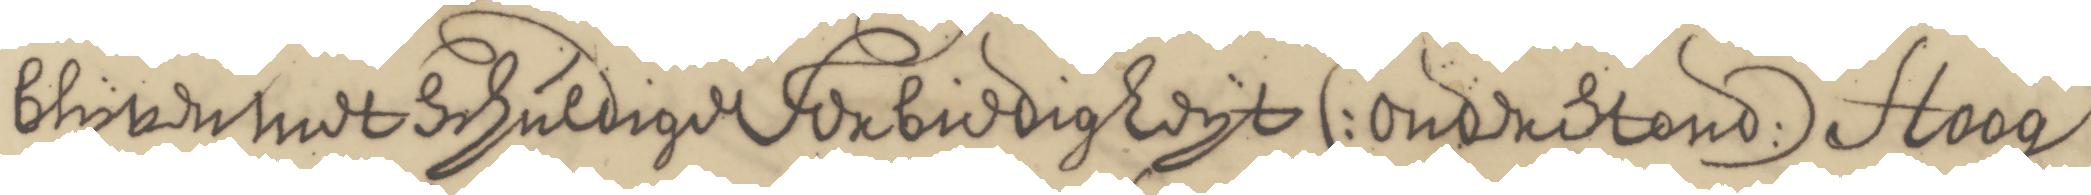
blijven met schuldige Eerbiedigheijt (:onderstond:) Hoog
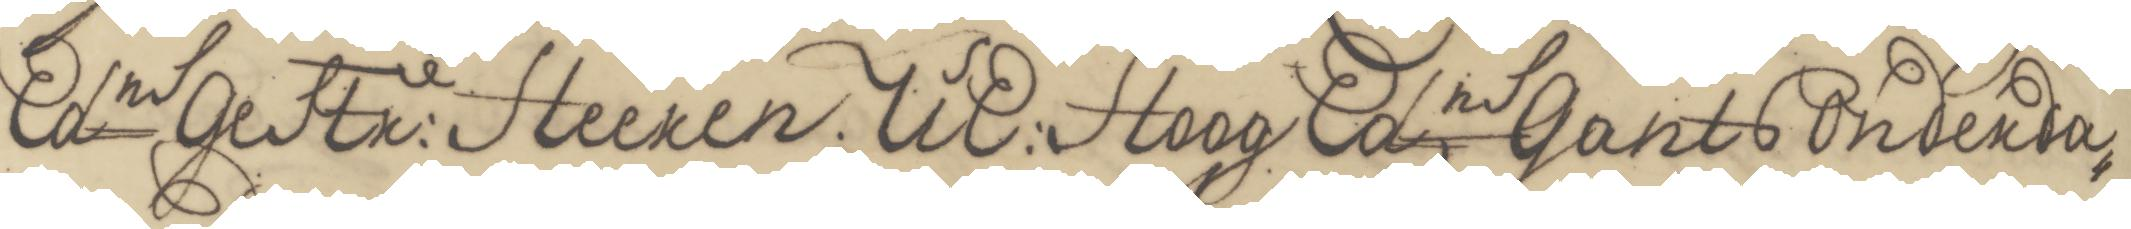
Ed=ns gestr:e Heeren; UE: Hoog Ed=ns gants onderda„
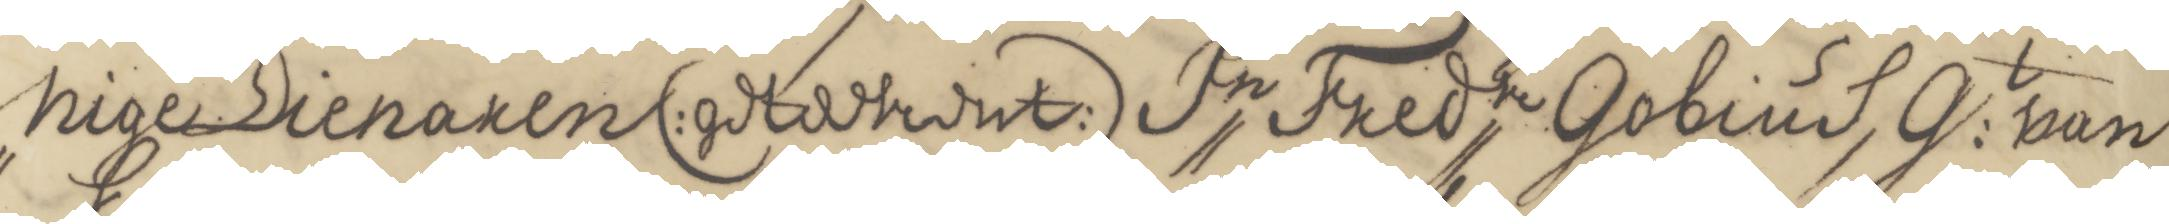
„nige Dienaren (:geteekent:) J„n Fred„k Gobius, G:t van
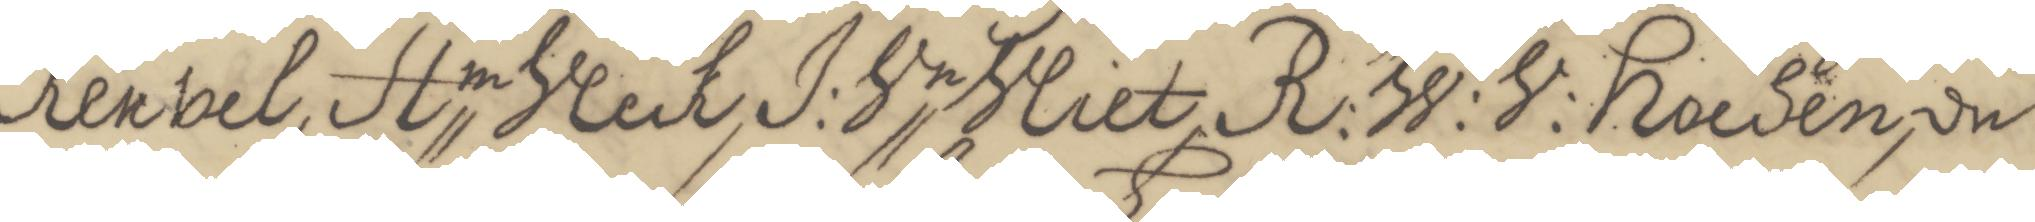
Kervel, H„m Vleck, J: V„n Vliet, R: W: V: hoesen, en
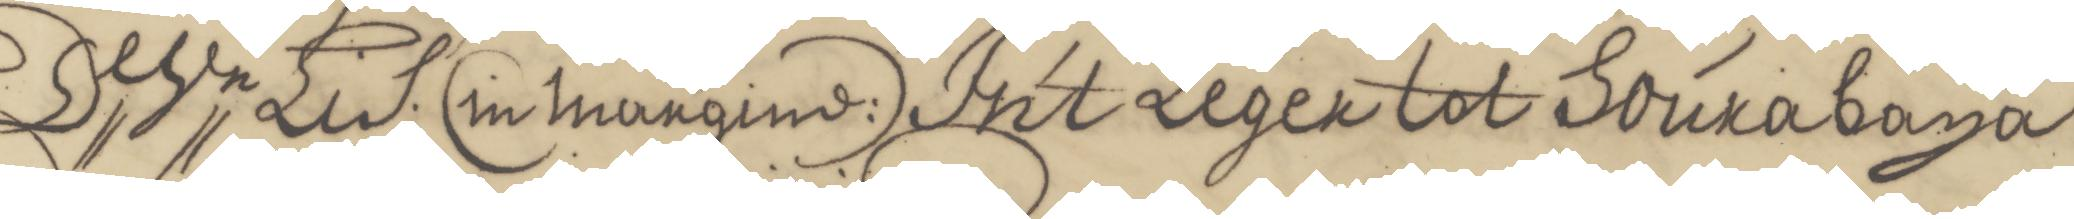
D„l V„n Lis; (in margine:) In't Leger tot Sourabaija
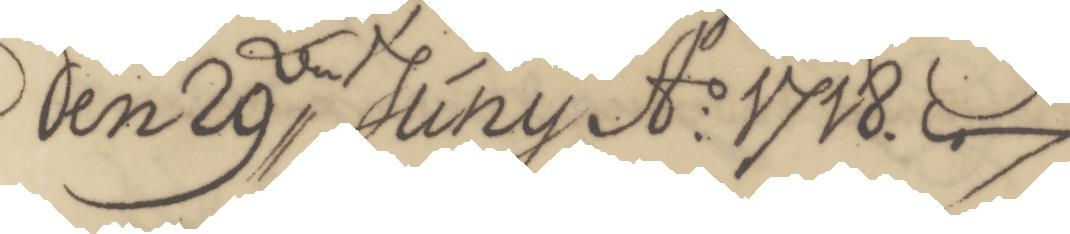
den 29„en Iunij A:o 1718. —
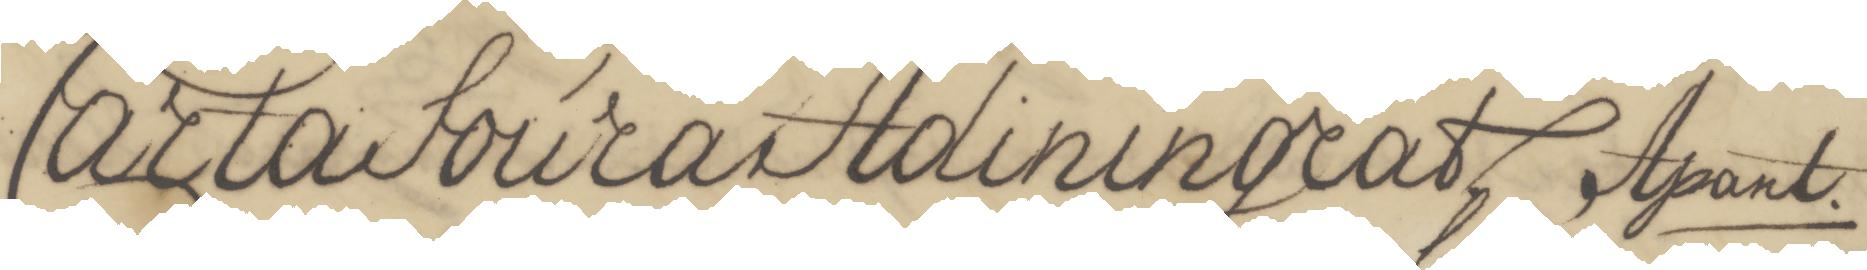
Carta Soura Adiningrat Apart:
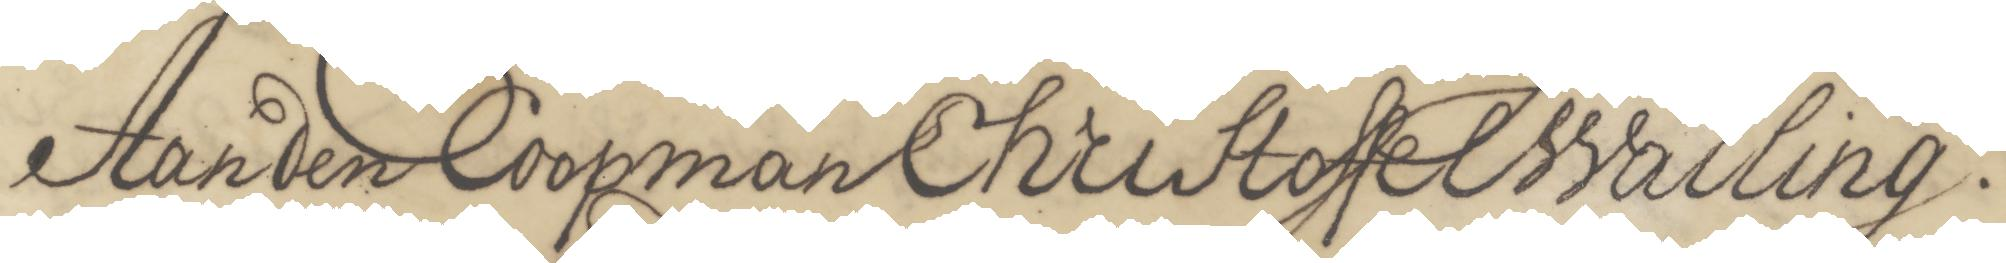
Aan den Coopman Christoffel Walling.
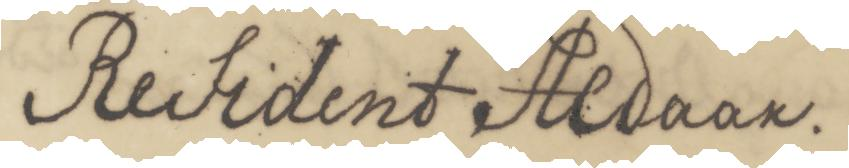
Resident Aldaar.
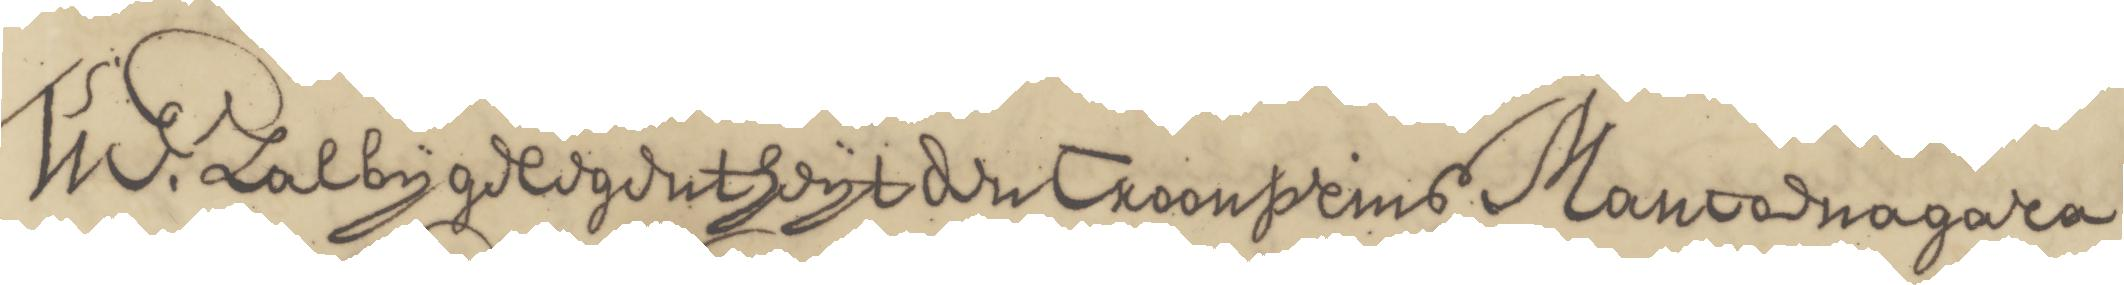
UE. Zal bij gelegentheijt den Croonprins Mancoenagara
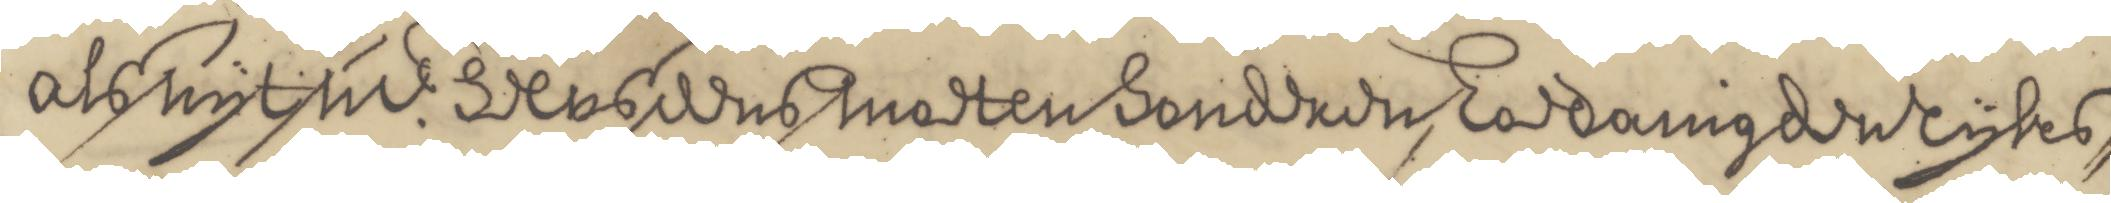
als uijt uE: selvs eens moeten sonderen, hoedanig den rijks„
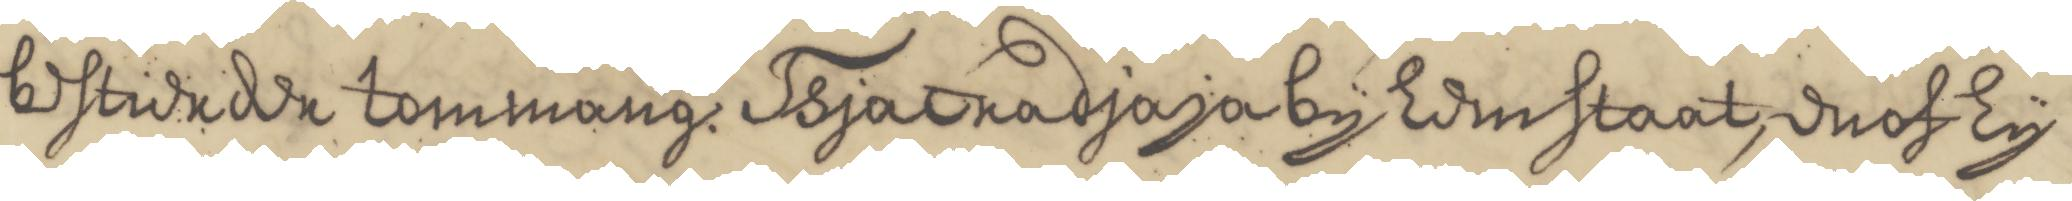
bestierder tommang:' Tsjacradjaja bij hem staat, en of hij
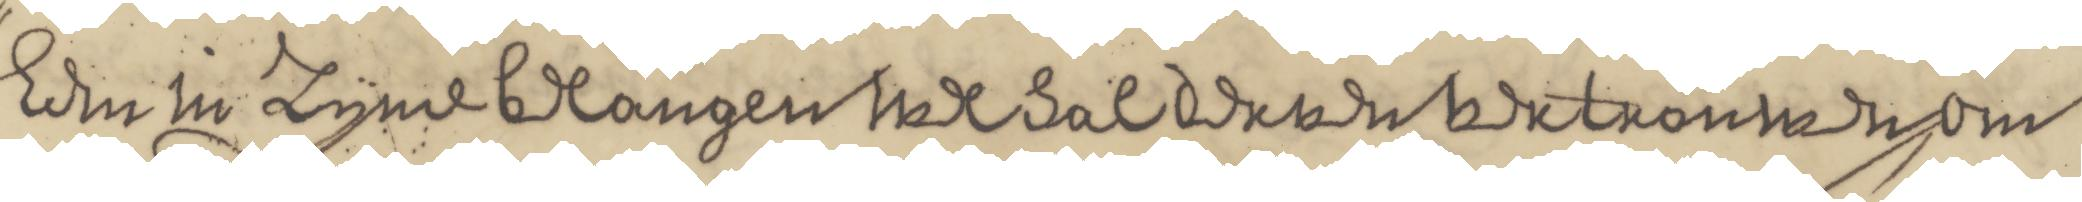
hem in Zijne belangen wel sal derven vertrouwen, om
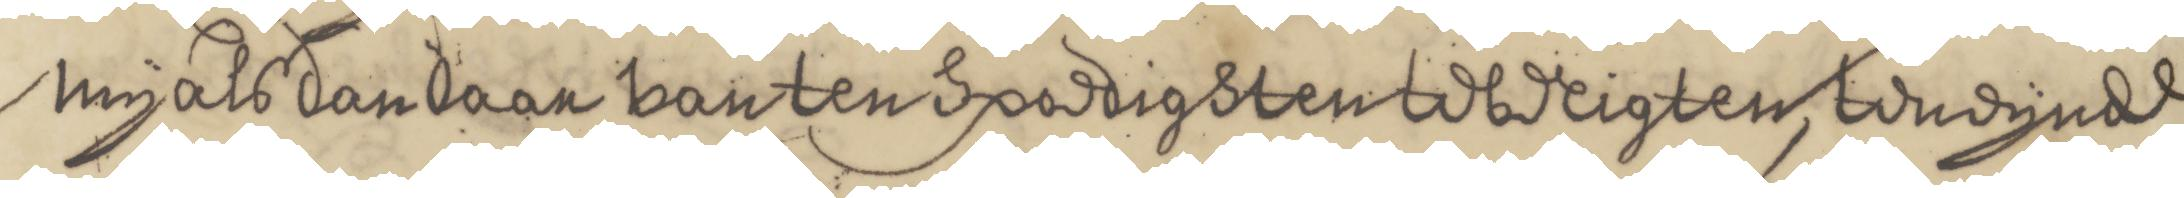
mij als dan daar van ten spoedigsten te berigten, teneijnde
